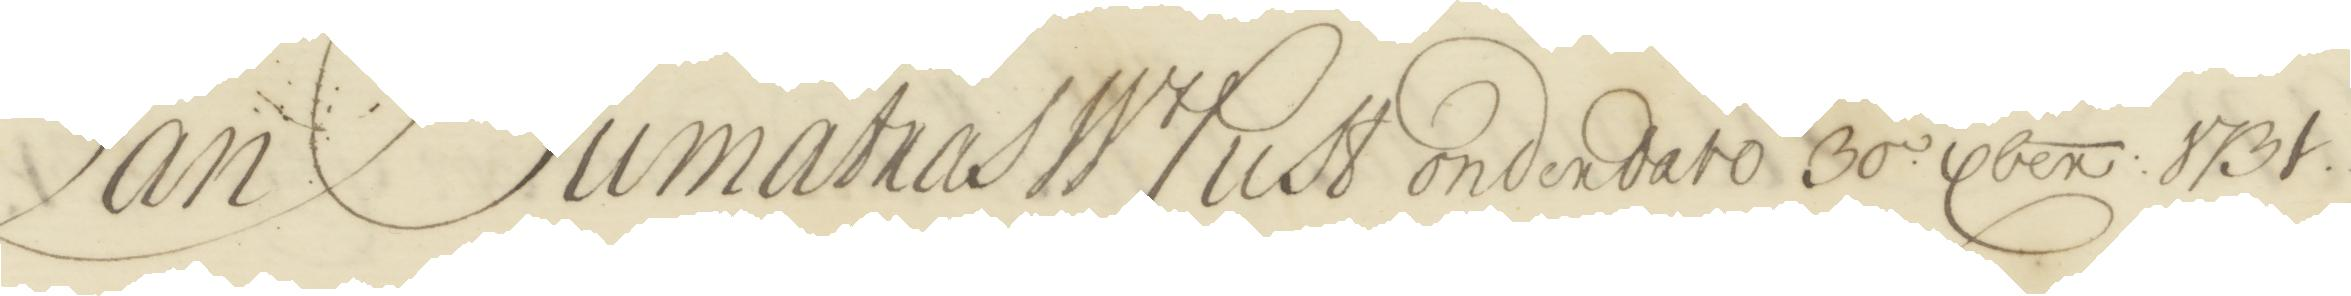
Van Sumatras Wt Cust onder dato 30. xber: 1731.
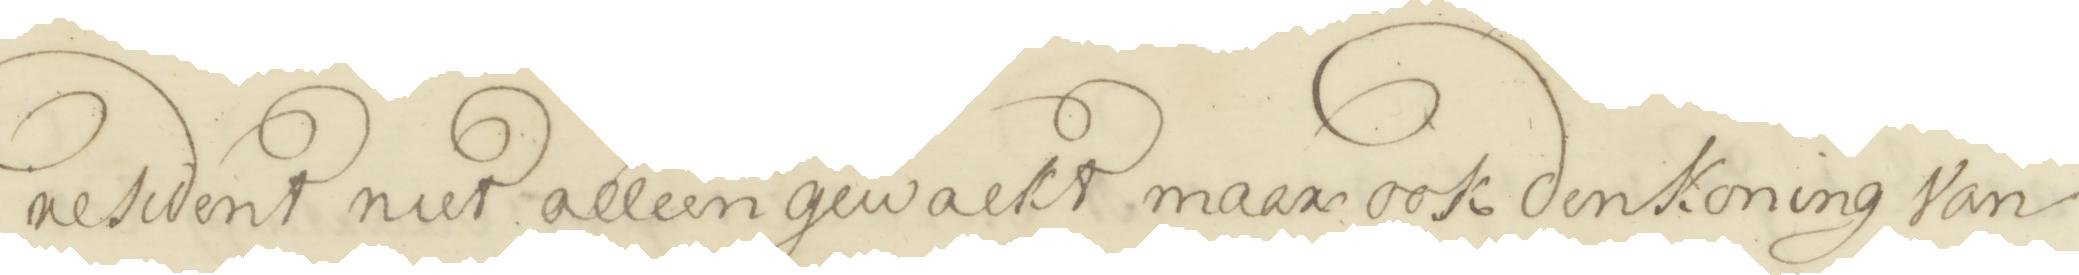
resident niet alleen gewaekt maar ook den Koning van
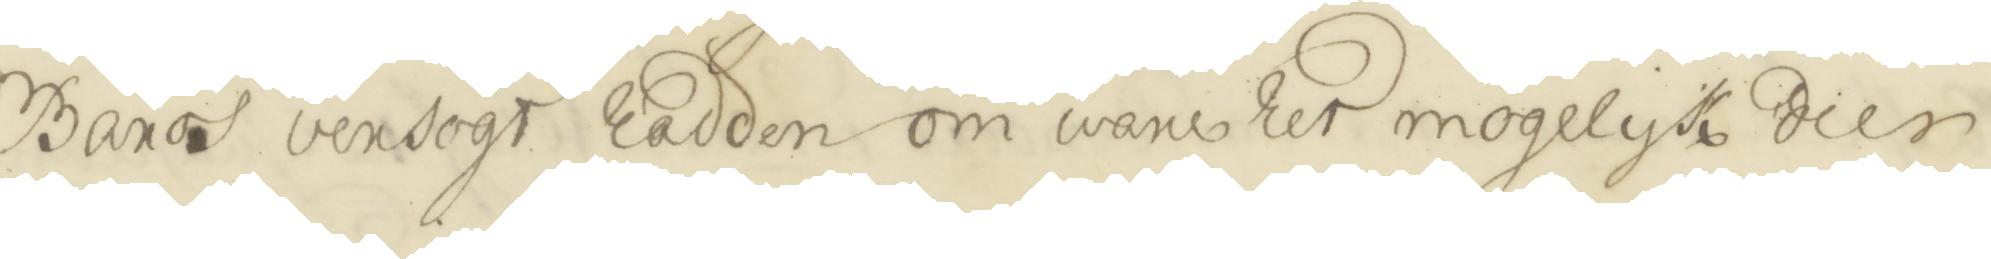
Baros versogt hadden om ware het mogelijk dier
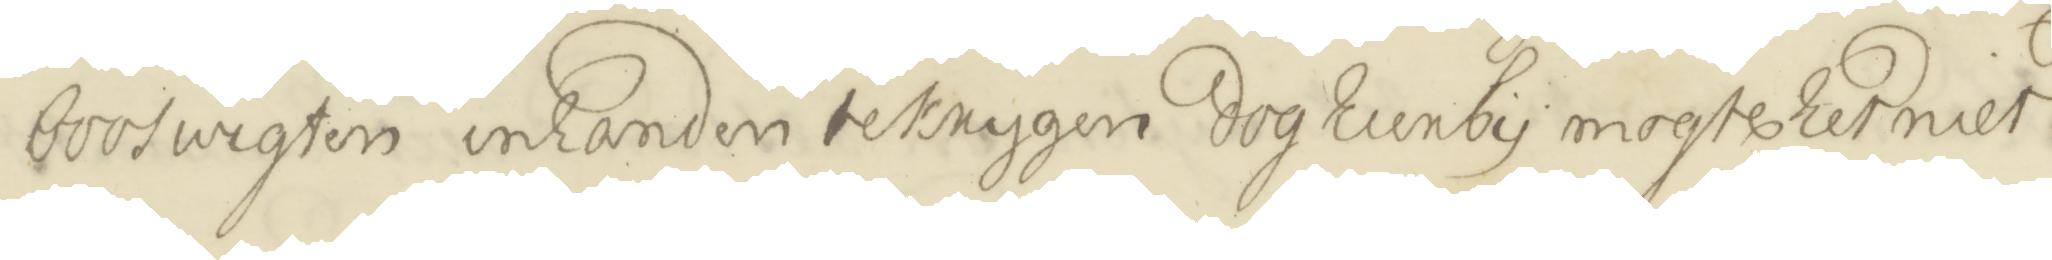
booswigten inhanden tekrygen dog hierbij mogte het niet
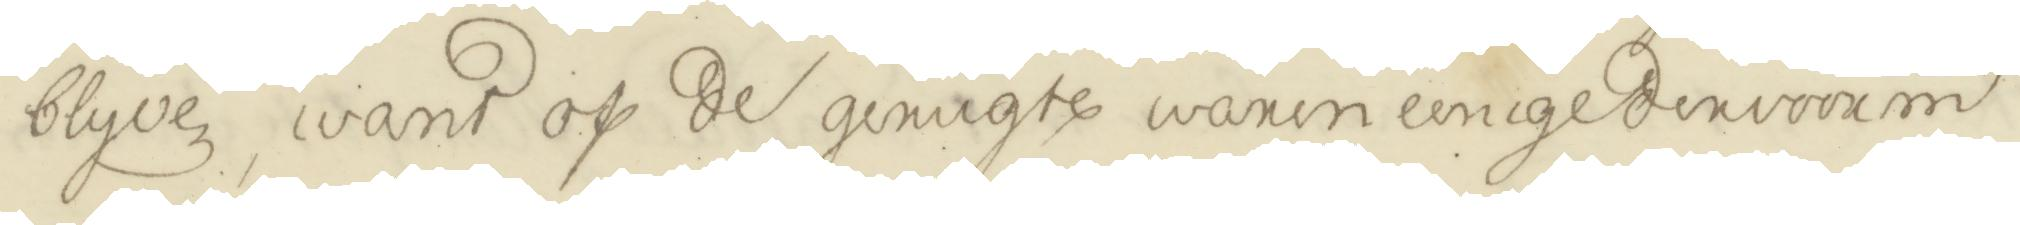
blijven, want op de gerugte waren eenige der voorm
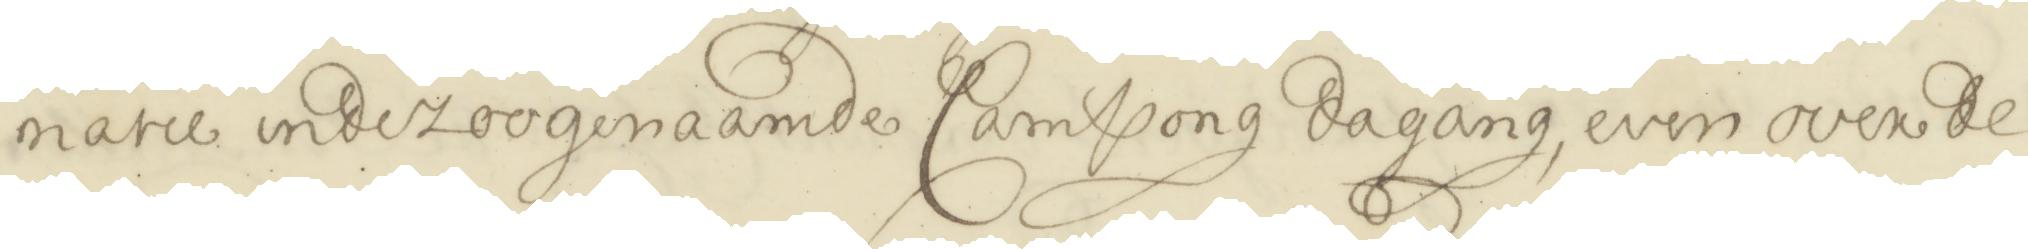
natie indezoogenaamde Campong dagang, even over de
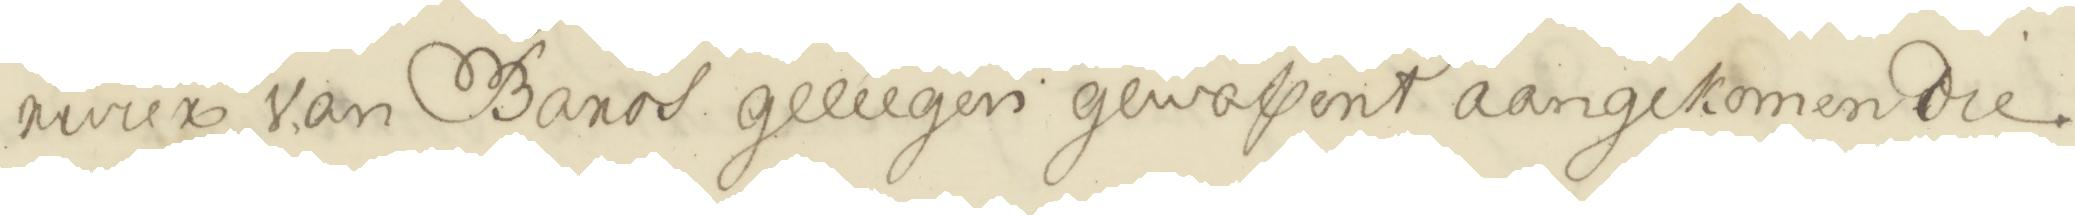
rivier van Baros geleegen gewapent aangekomen die
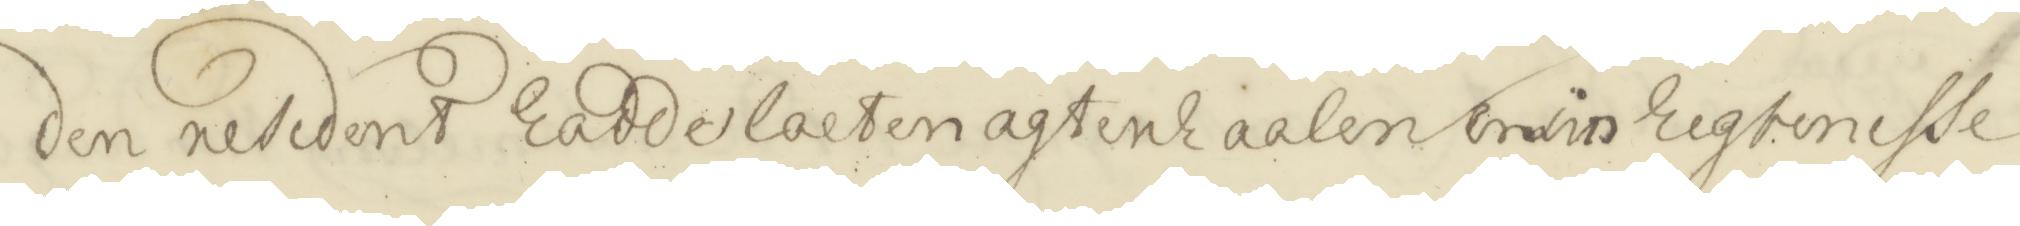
den resident hadde laeten agterhaalen en in hegtenesse
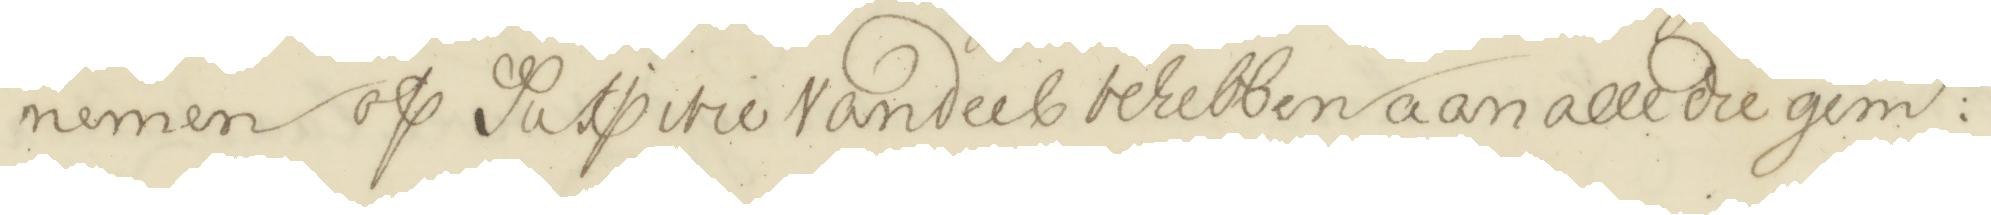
nemen op Suspitie van deel te hebben aan alle die gem:
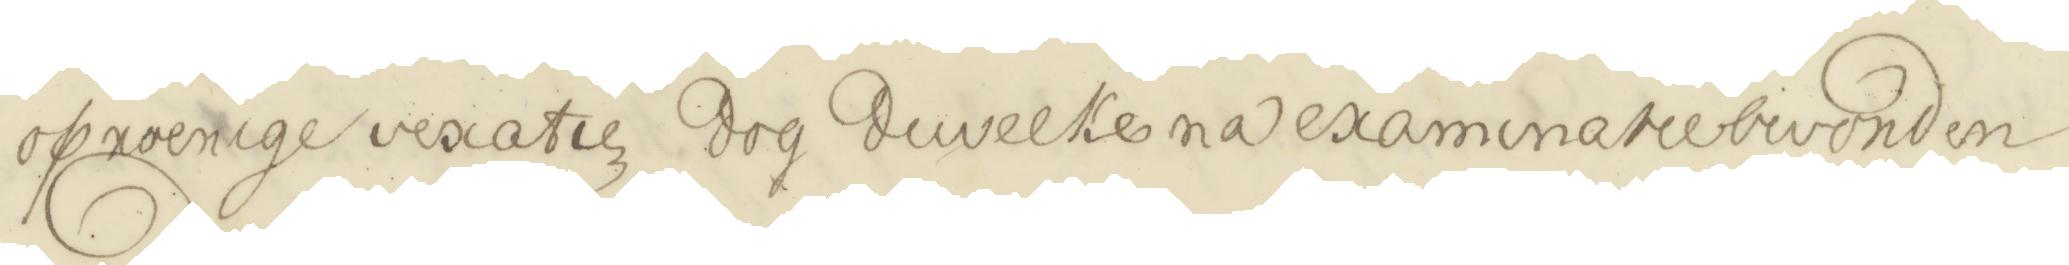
oproerige vexatien dog dewelke na examinatie bevonden
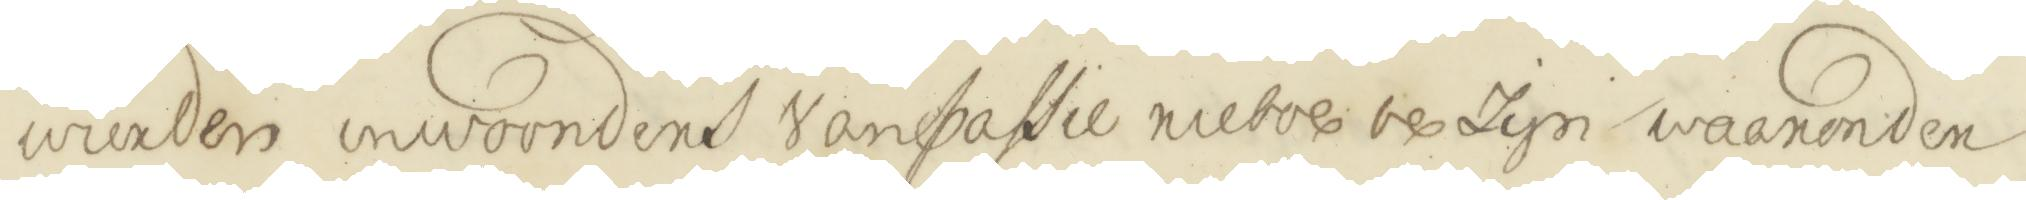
wierden inwoonders van passie rieboe te zijn waaronder
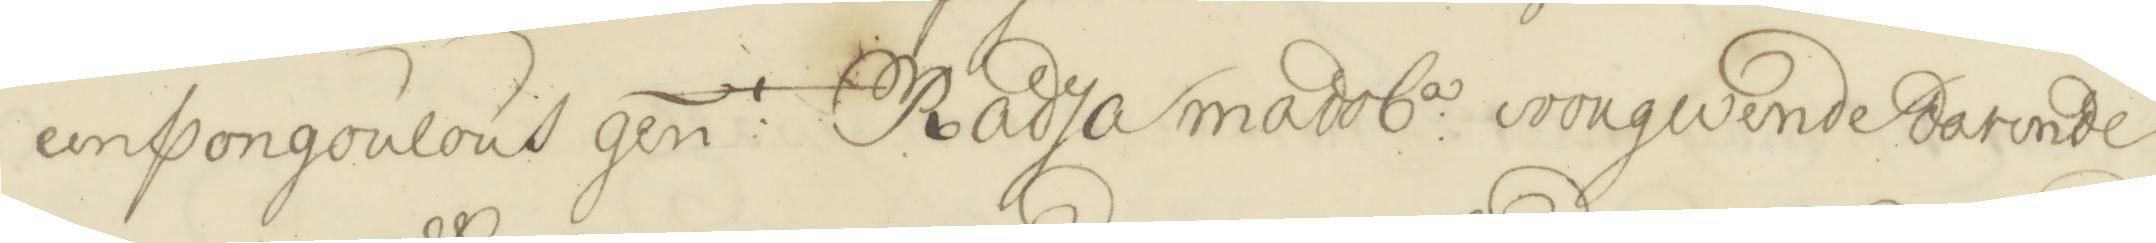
een Pongoulous gen:t Radja madob:a voorgevende datinde
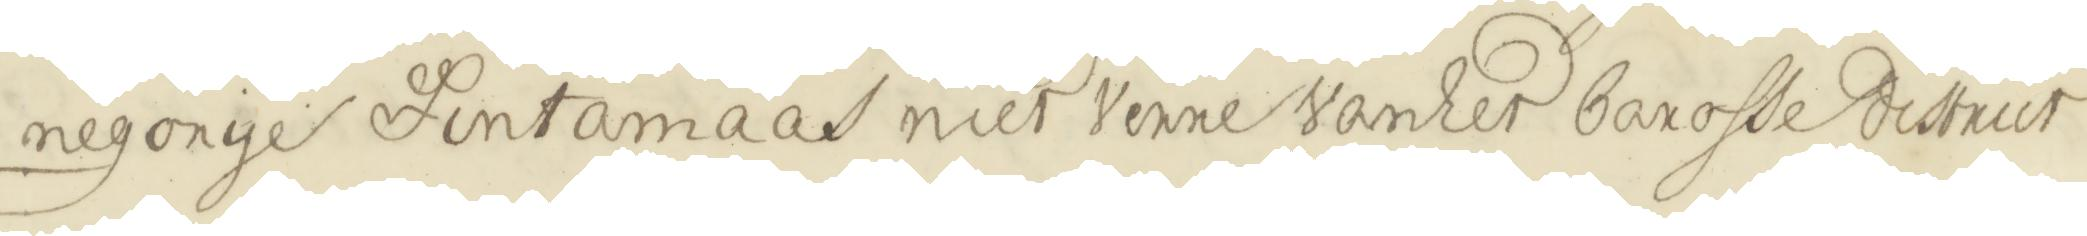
negorije Tintamaas niet verre van het barosse district
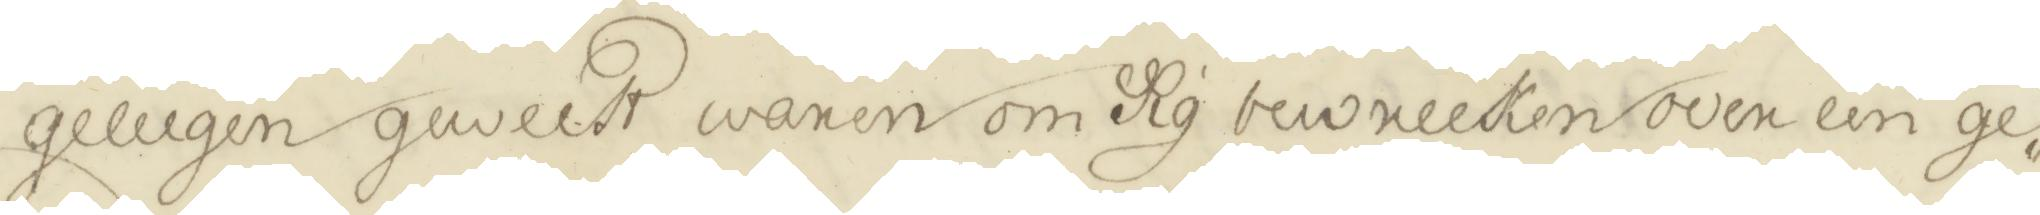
geleegen geweest waren om sig tewreeken over een ge„
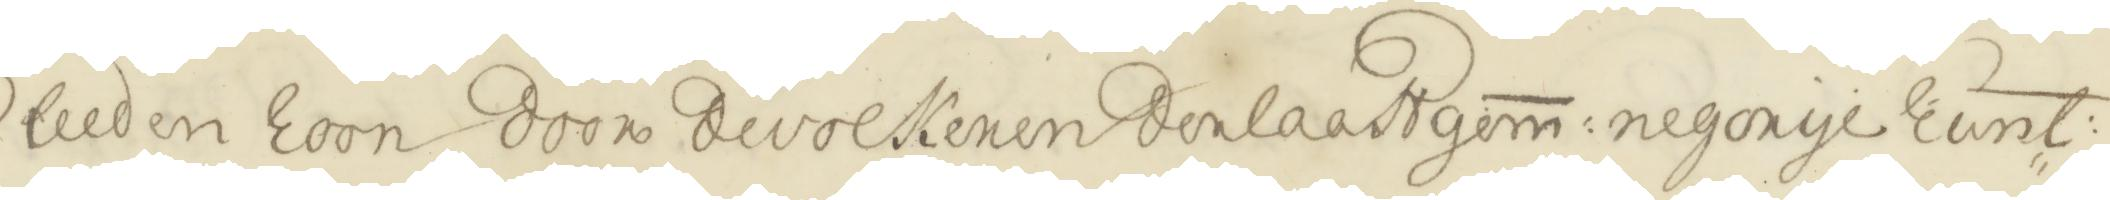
leeden hoon door devolkeren der laast gem: negorije hunt:„
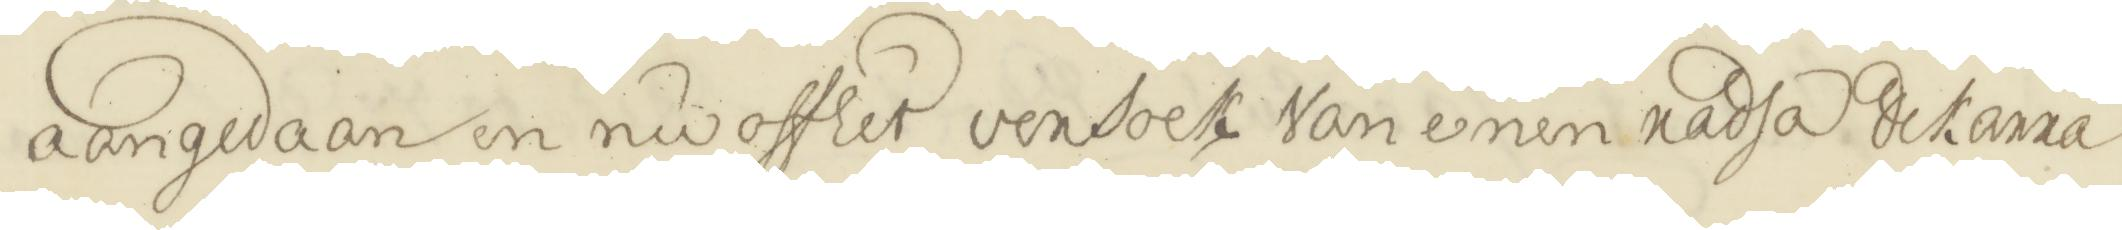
aangedaan en nu off het versoek van enen radja dekarra
